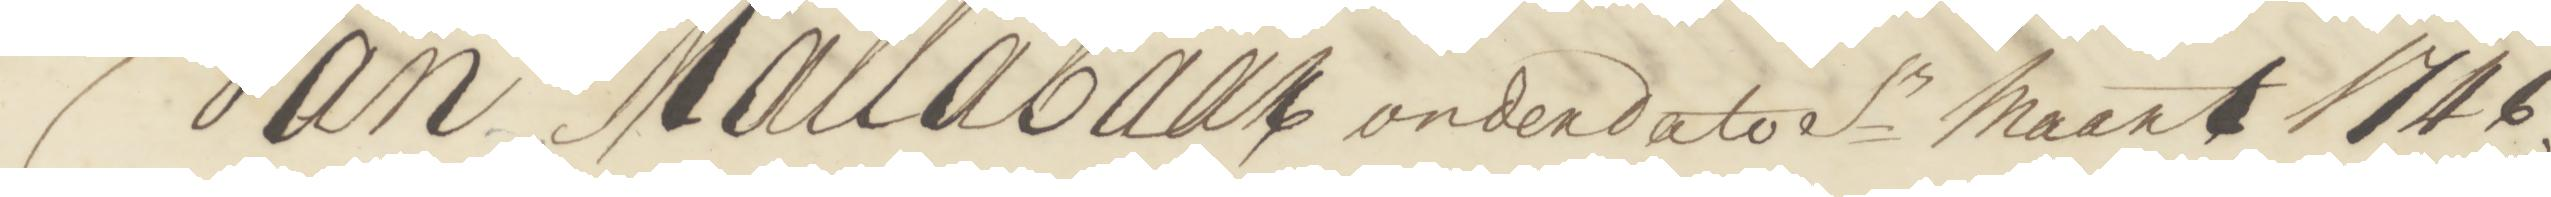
Van Mallabaar onder dato 1=en Maart 1746
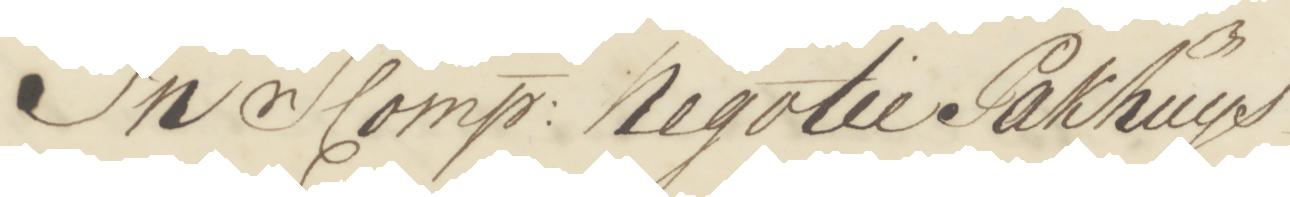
In ’sComp: Negotie Pakhuijs
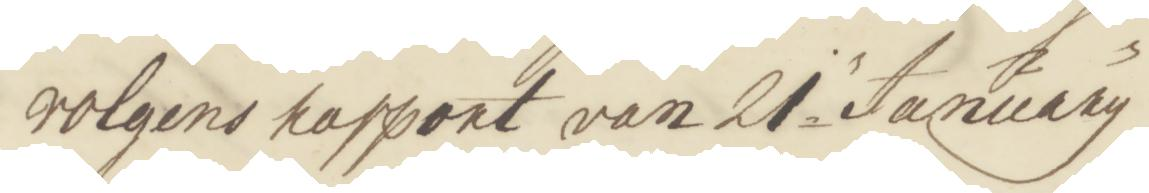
volgens rapport van 21=' Ianuarij
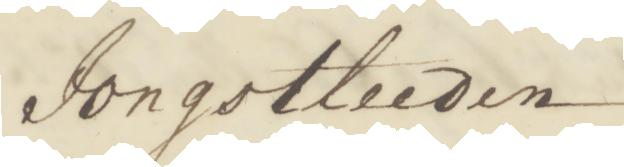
Iongstleeden
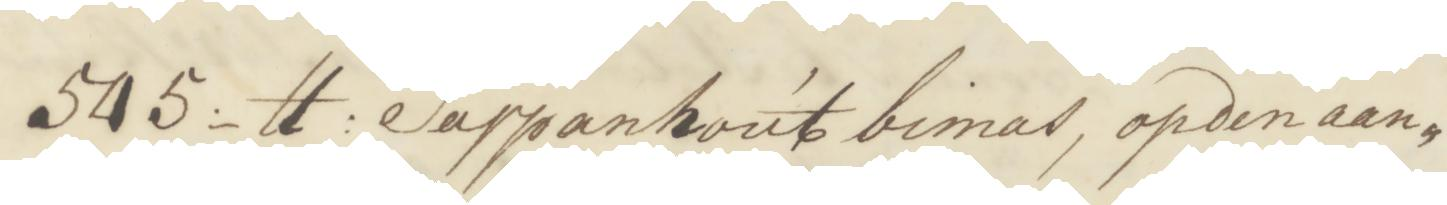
545: — lb: sappanhout bimas, op den aan„
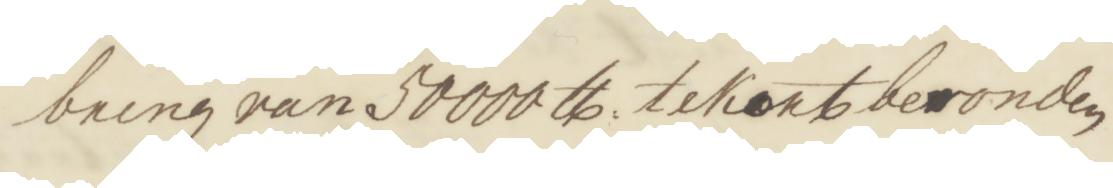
breng van 50000 lb. tekort bevonden
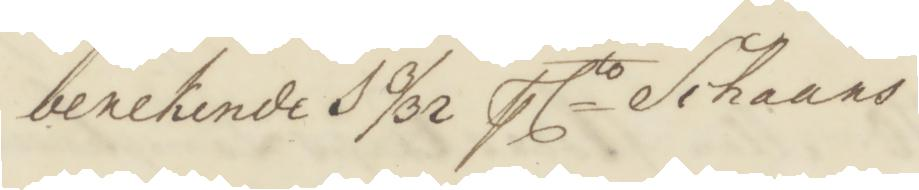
berekende 1 3/32 pC=to schaars
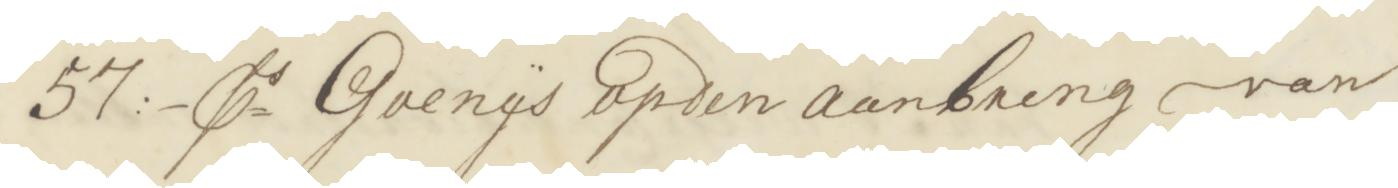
57: — p=s Goenijs op den aanbreng van
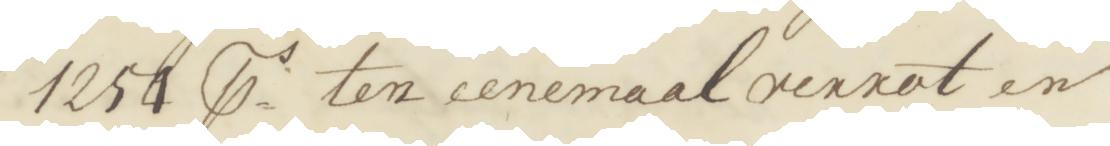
1254 p=s ten eenemaal verrot en
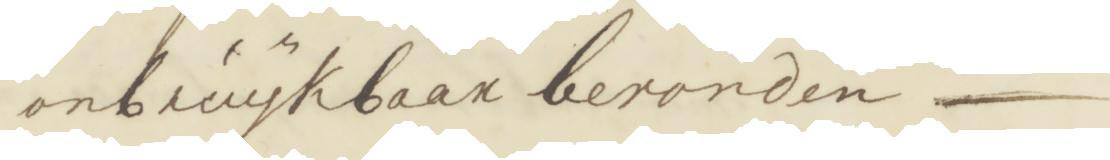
onbruijkbaar bevonden —
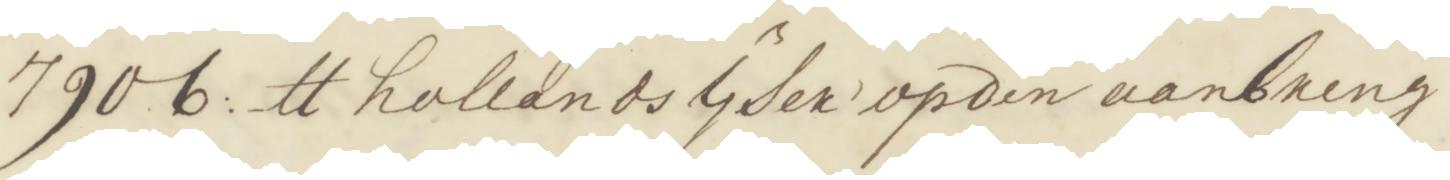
790. 6: lb hollands ijser op den aanbreng
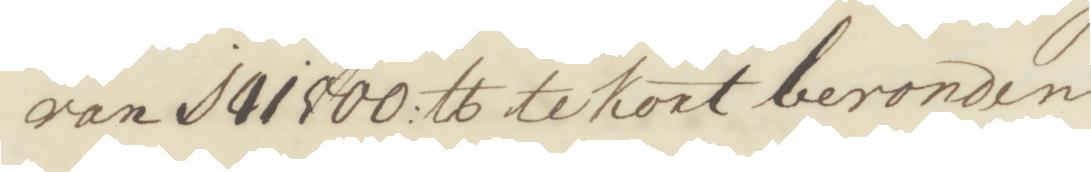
van 141500: lb te kort bevonden
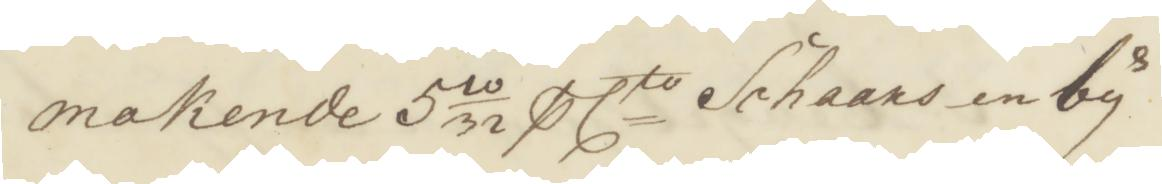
makende 5 10/32 pC=to schaars en bij
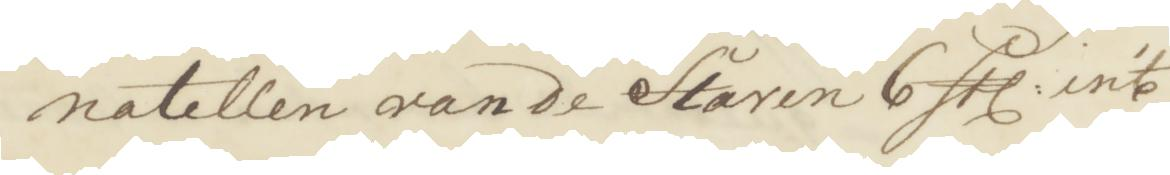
natellen van de staven 6 stx: in’t
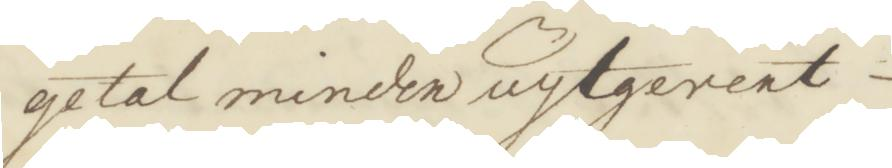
getal minder uijtgevent -
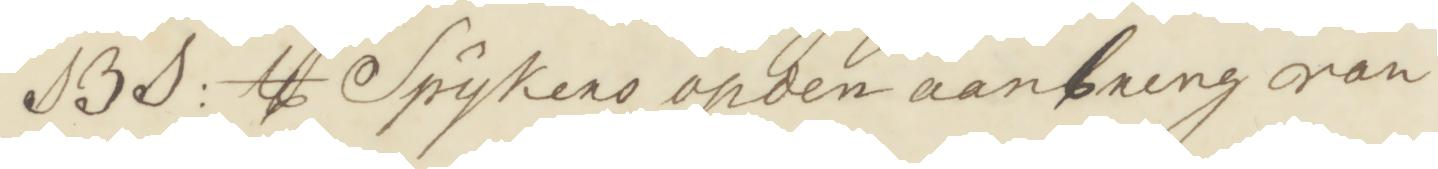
131: lb Spijkers op den aanbreng van
